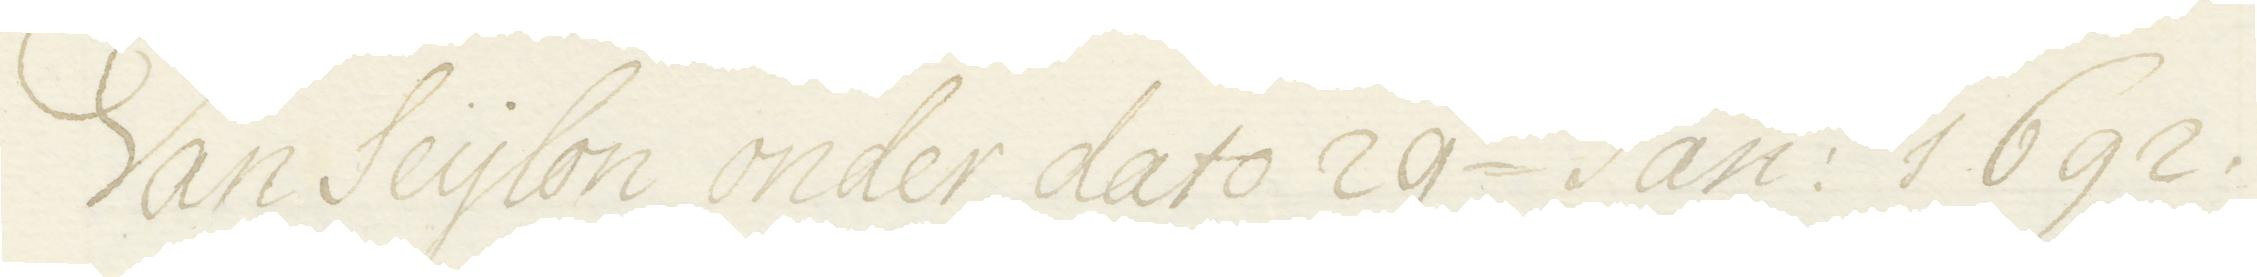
Van Seijlon onder dato 29=e Ian: 1692.
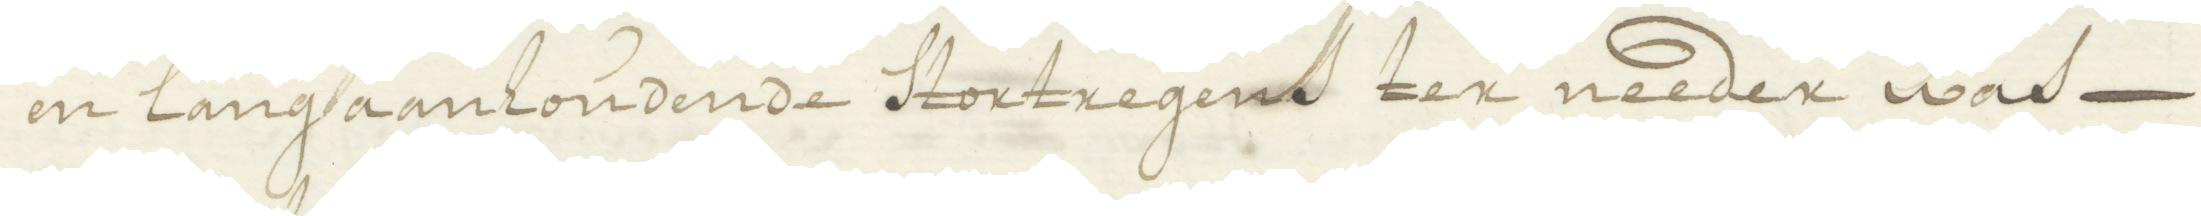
en lang aanhoudende stortregens ter needer was —
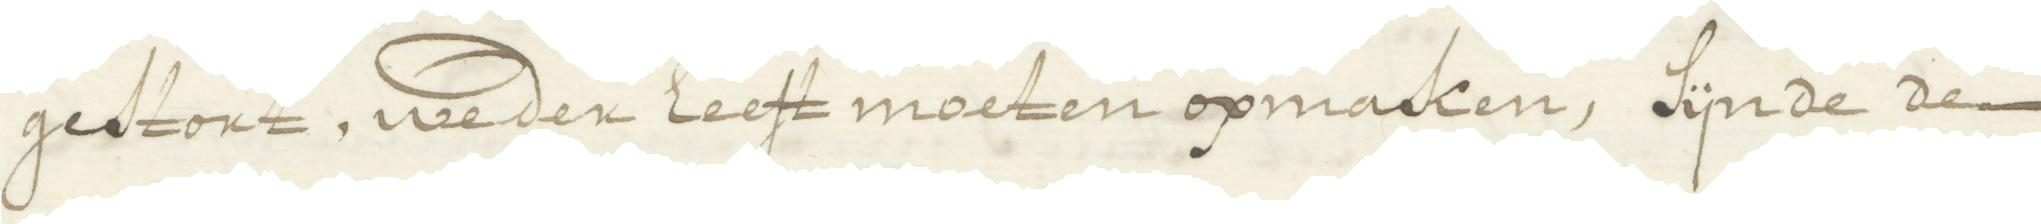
gestort, weder heeft moeten opmaken, sijnde de
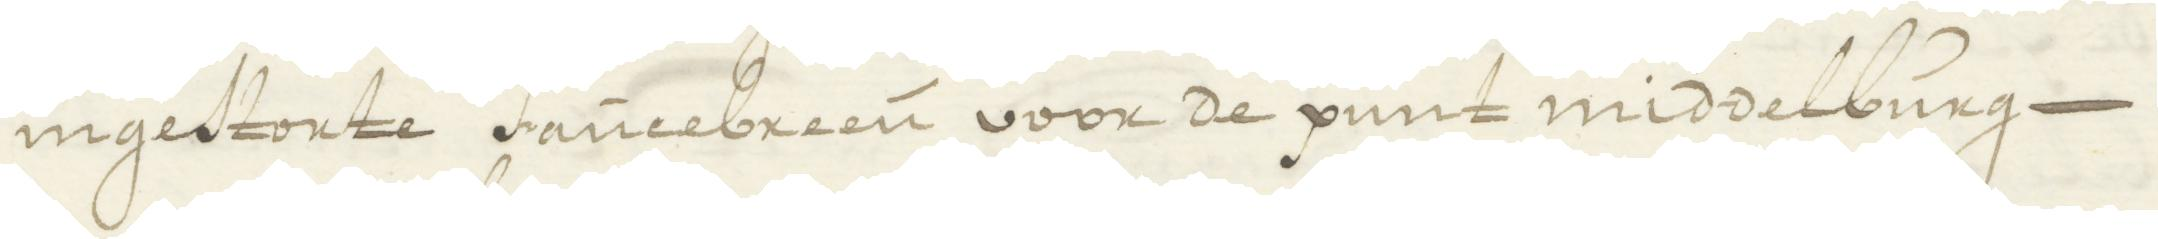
ingestorte Faucebreeu voor de punt middelburg —
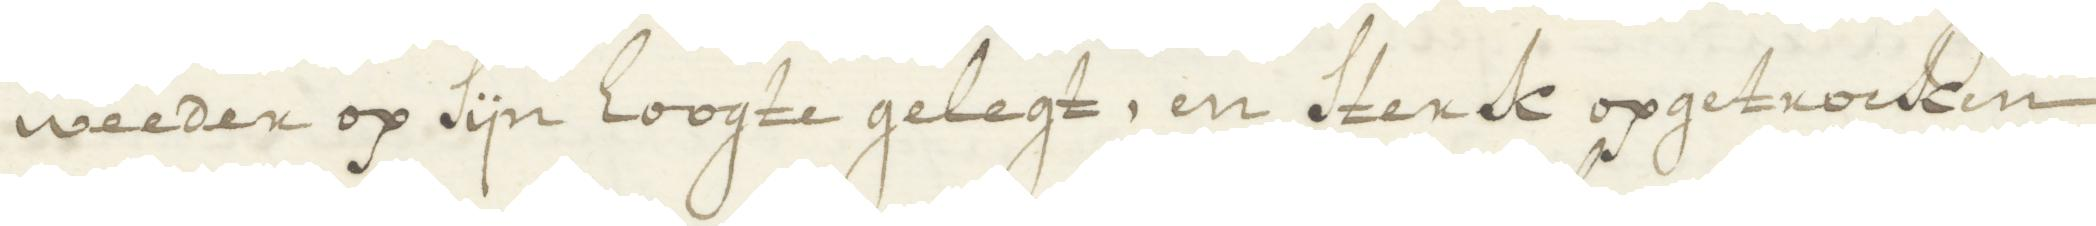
weeder op sijn hoogte gelegt, en sterk opgetrocken
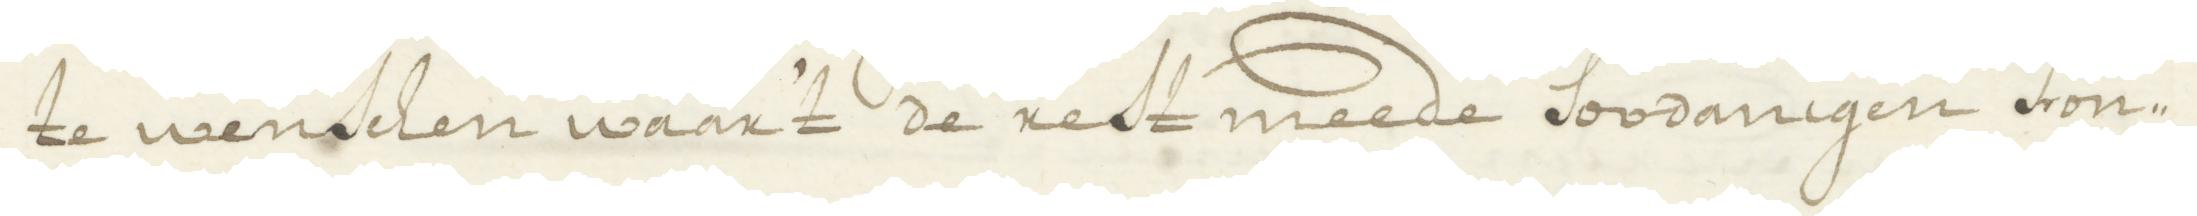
te wenschen waar ’t de rest meede soodanigen Fon„
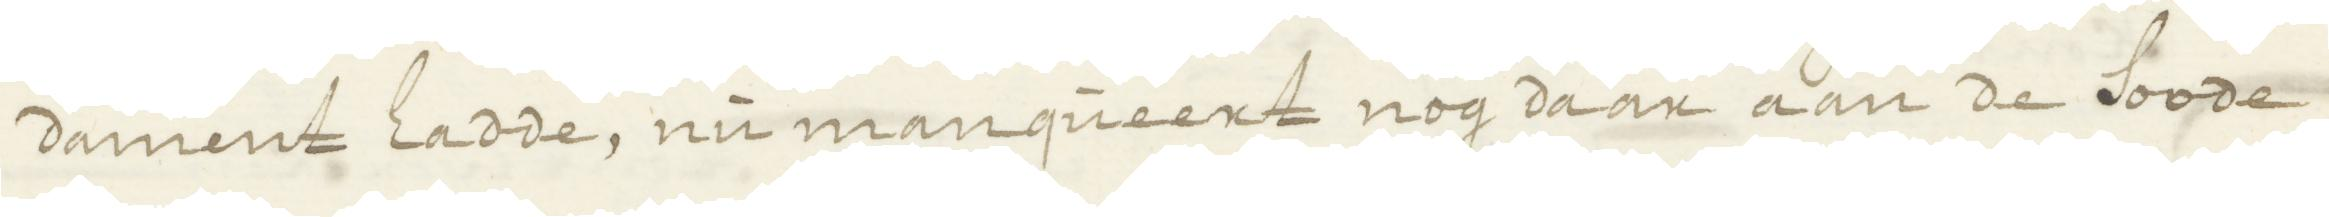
dament hadde, nu manqueert nog daar aan de soode
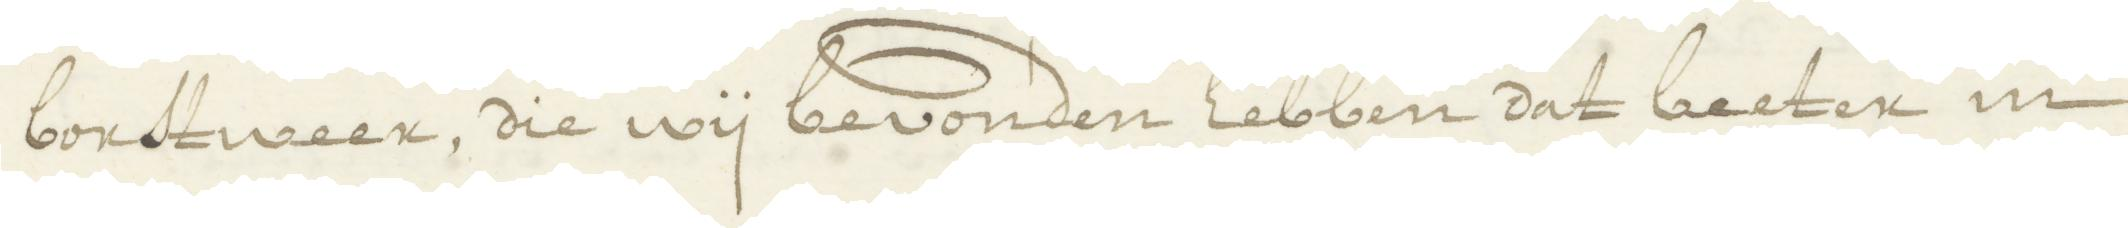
borstweer, die wij bevonden hebben dat beeter in
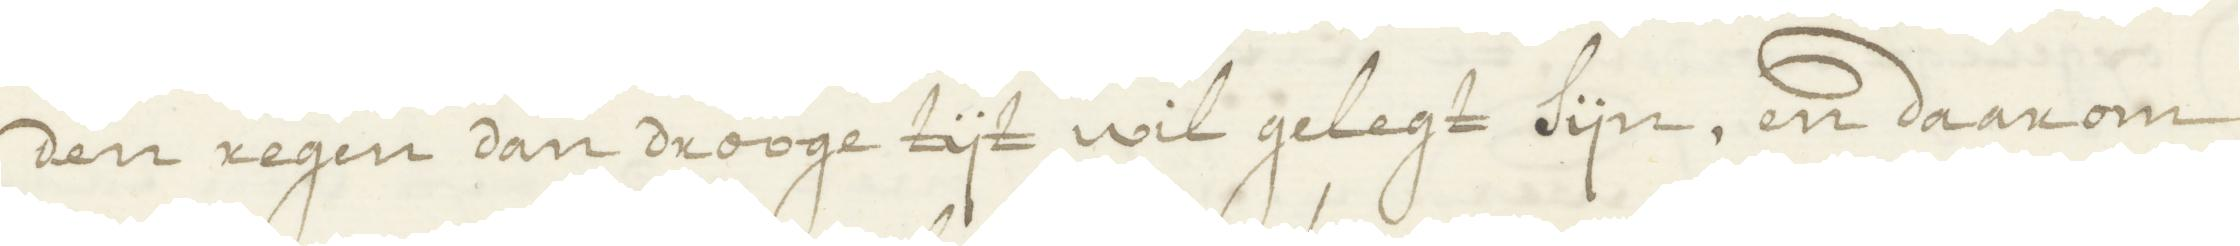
den regen dan drooge tijt wil gelegt sijn, en daar om
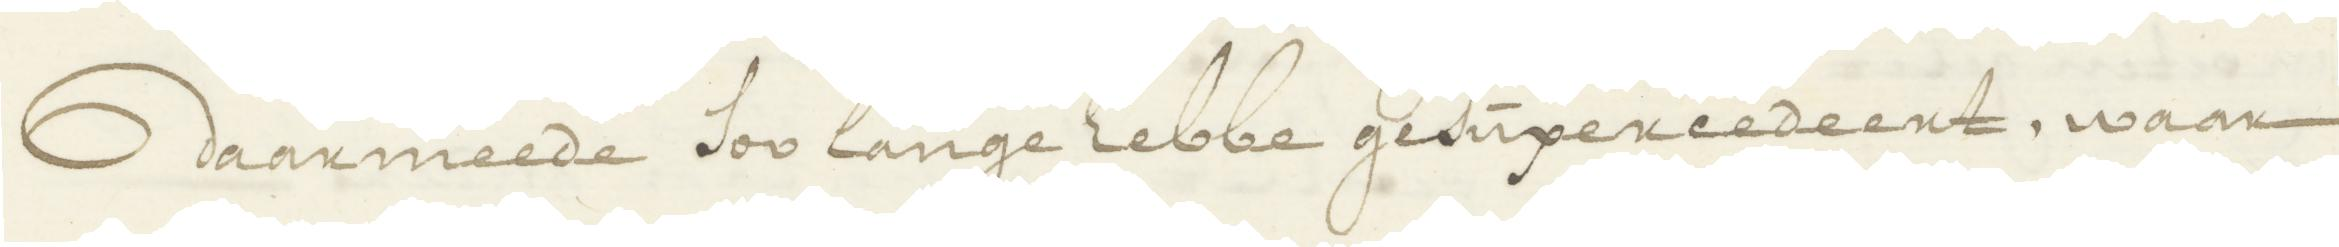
daarmeede soo lange hebbe gesupercedeert, waar
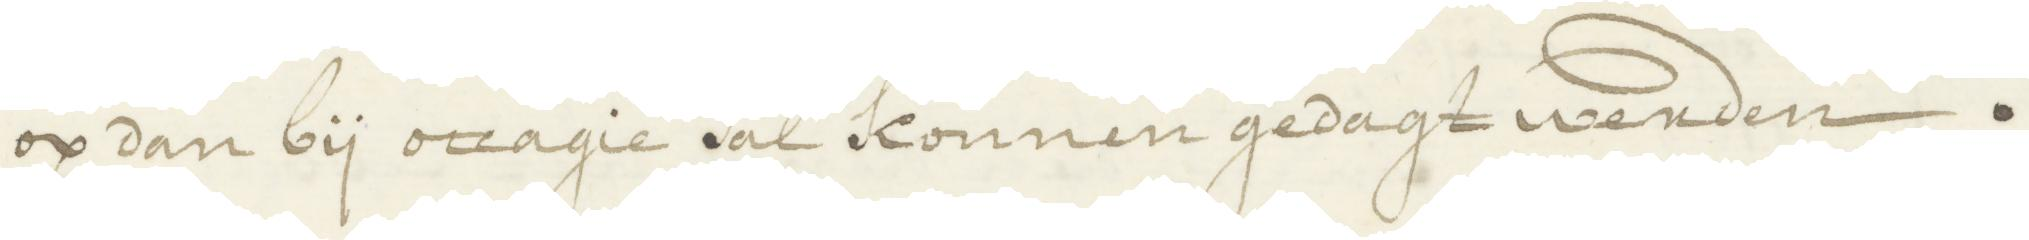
op dan bij occagie sal konnen gedagt werden.
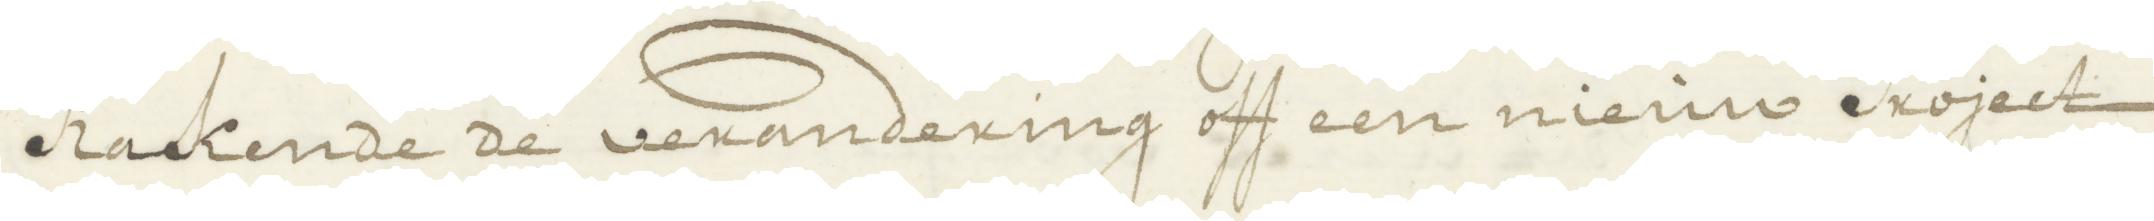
Rakende de verandering off een nieuw Project
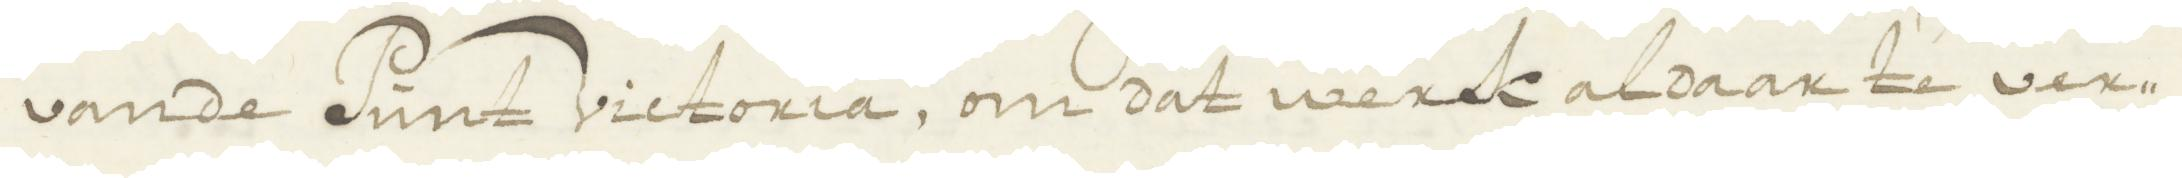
van de Punt Victoria, om dat werk aldaar te ver„
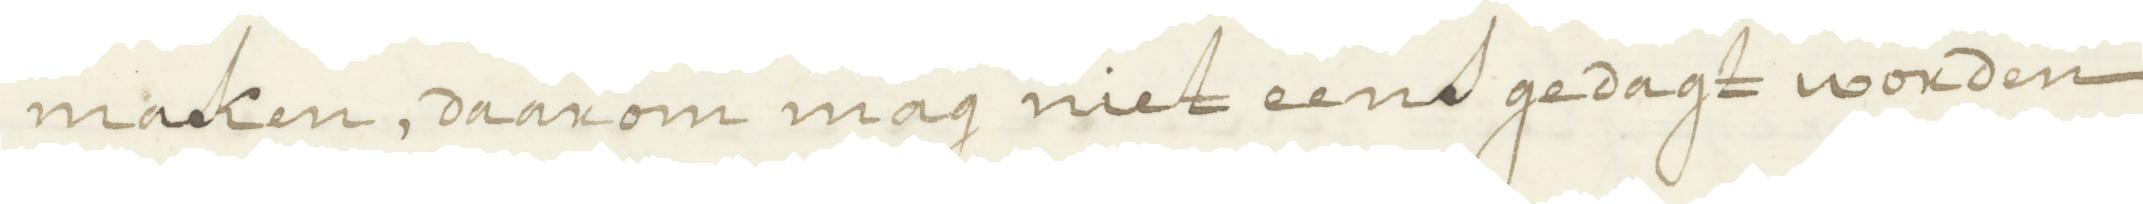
maken, daarom mag niet eens gedagt worden
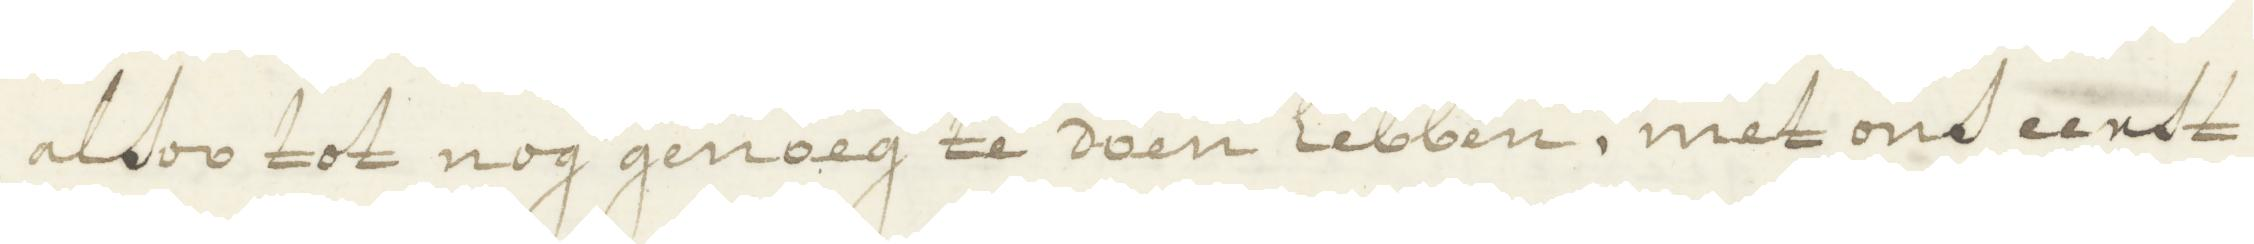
alsoo tot nog genoeg te doen hebben, met ons eerst
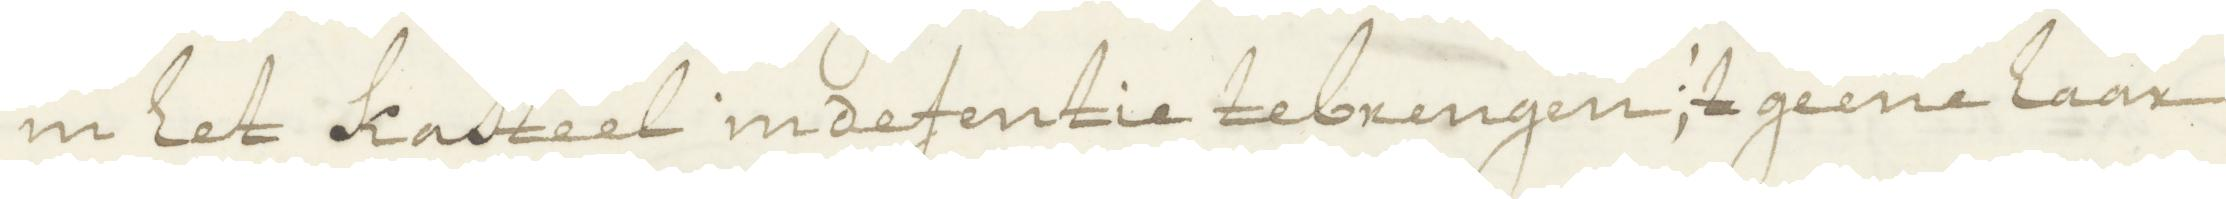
in het kasteel in defentie tebrengen; ’t geene haar
